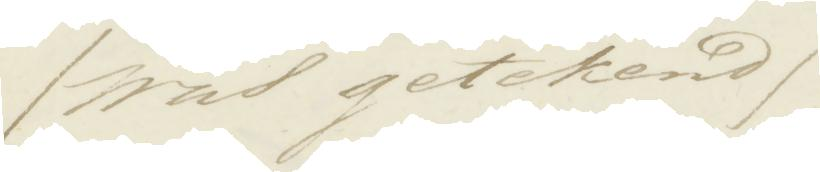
/was getekend/
